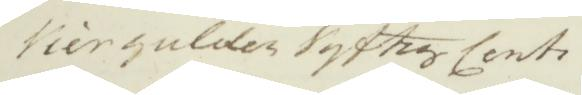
Vier gulden Vyftig Cents
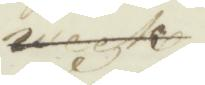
week ¶
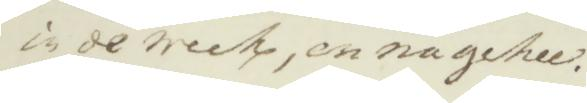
in de week, en na gehee
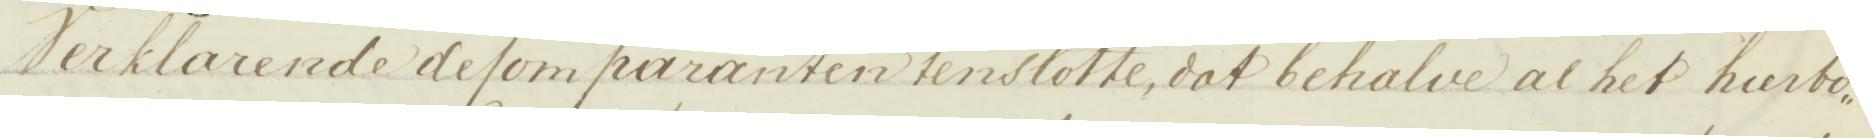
Verklarende de Comparanten tenslotte, dat behalve al het hierbo„
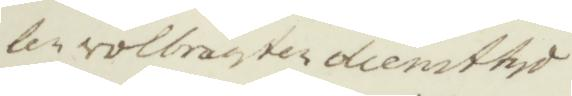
len volbragten diensttyd
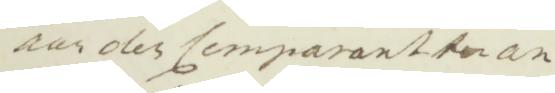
aan den Comparant ter an
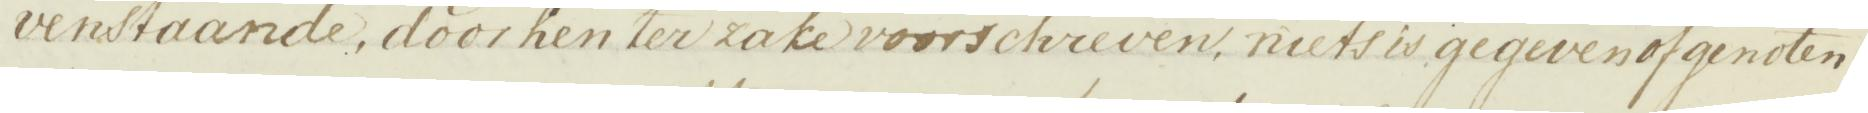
venstaande, door hen ter zake voorschreven, niets is gegeven of genoten
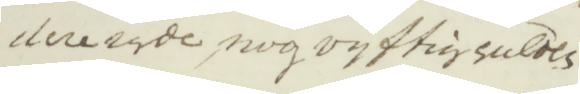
dere zyde nog vyftig gulden
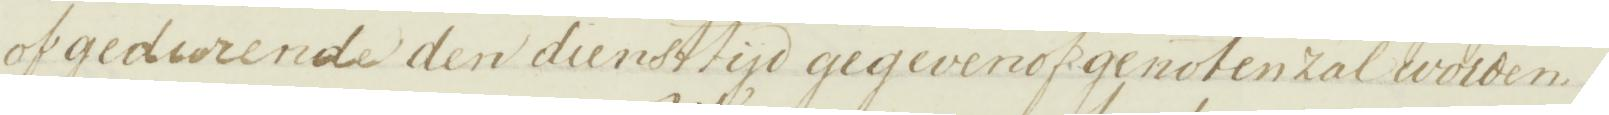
of gedurende den diensttijd gegeven of genoten zal worden.
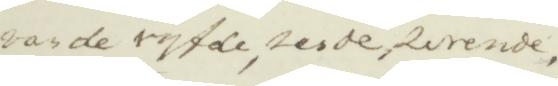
van de vyfde, zesde, zevende,
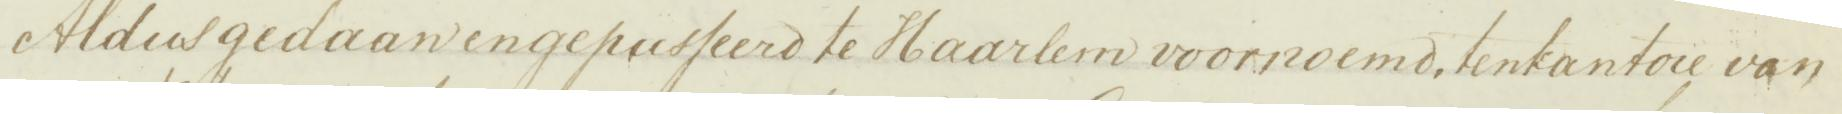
Aldus gedaan en gepasseerd te Haarlem voornoemd, tenkantore van
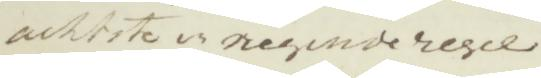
achtste en negende regel
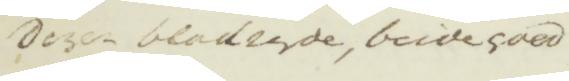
dezen bladzyde, beide goed
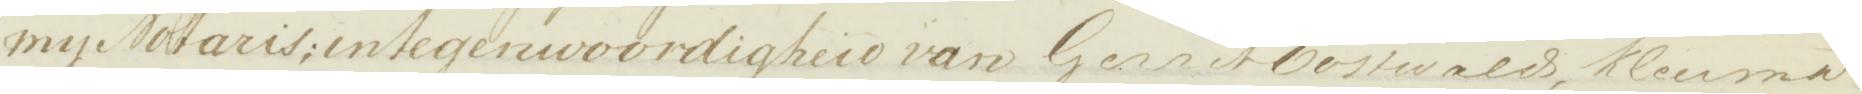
my Notaris; integenwoordigheid van Gerrit Oostwald, kleerma
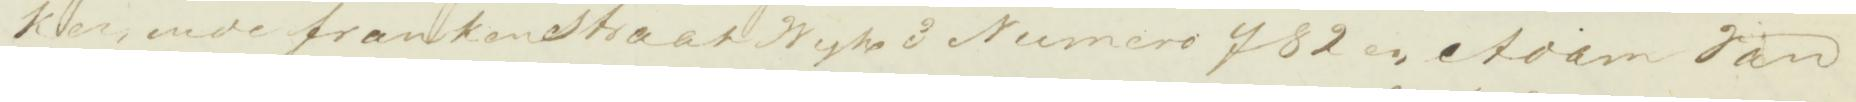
ker, inde frankenstraat Wyk 3 Numero 782 en Adam Van
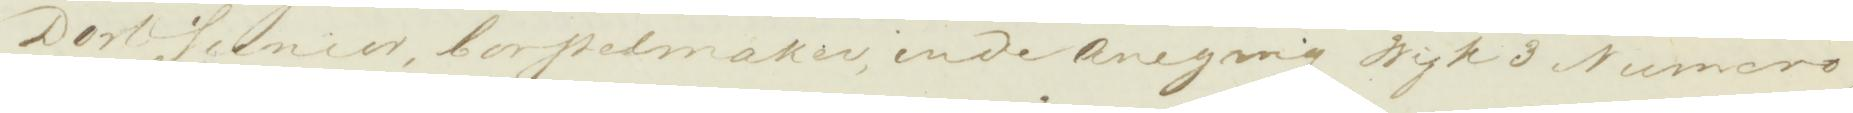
Dort Junior, borstelmaker, in de anegang Wijk 3 Numero
